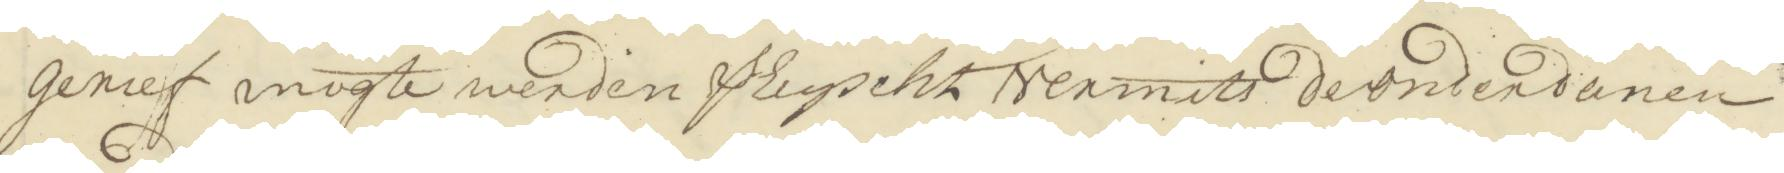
gerief mogte werden verEyscht vermits de onderdanen
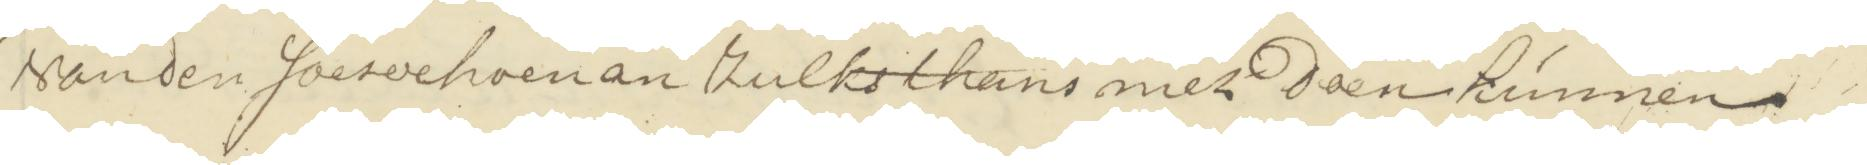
van den soesoehoenan zulks thans niet doen kunnen
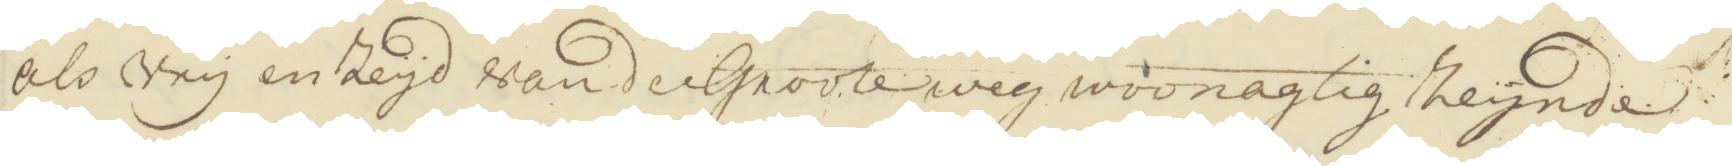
als vrij en zeijd van de Groote weg woonagtig Zeijnde
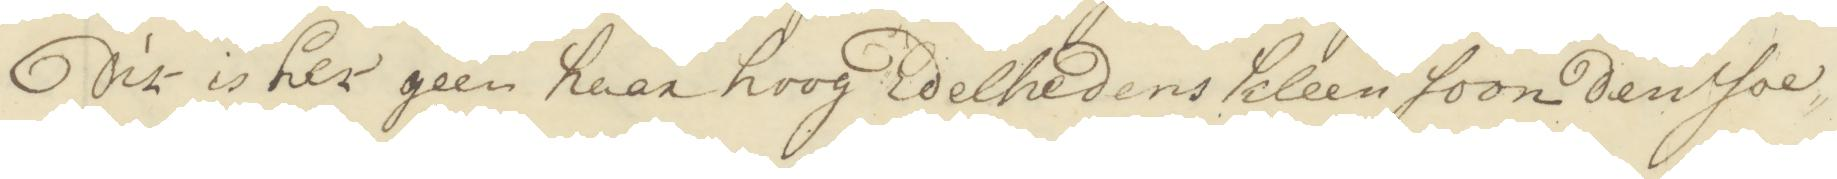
dit is het geen haar hoog Edelhedens kleensoon den soe„
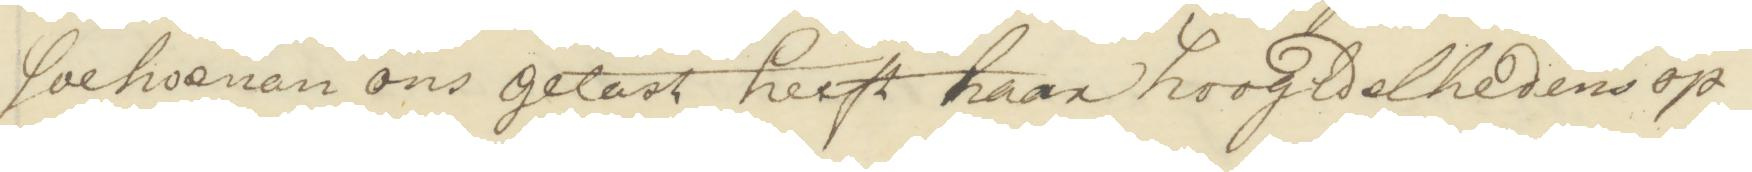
soehoenan ons gelast heeft haar hoog Edelhedens op
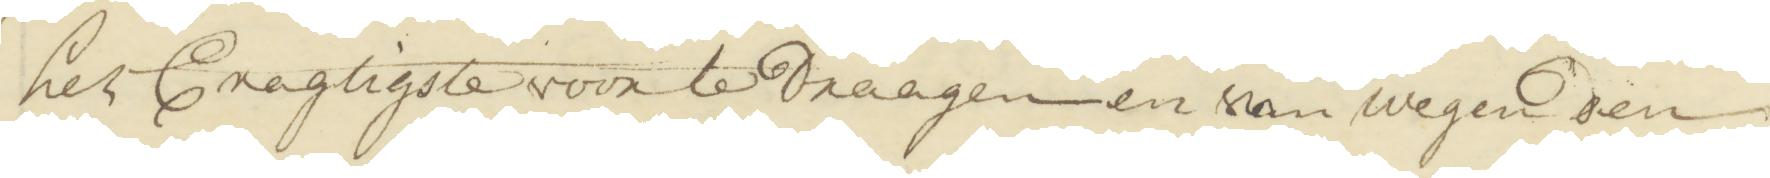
het Cragtigste voor te draagen en van wegen den
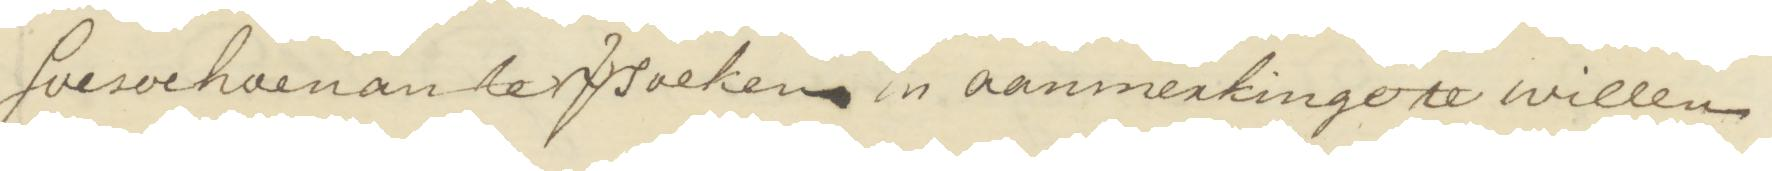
soesoehoenan ter versoeken in aanmerkinge te willen
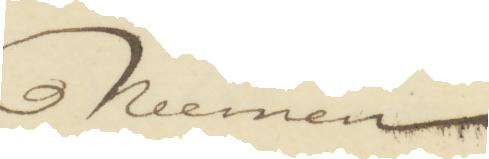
Neemen
